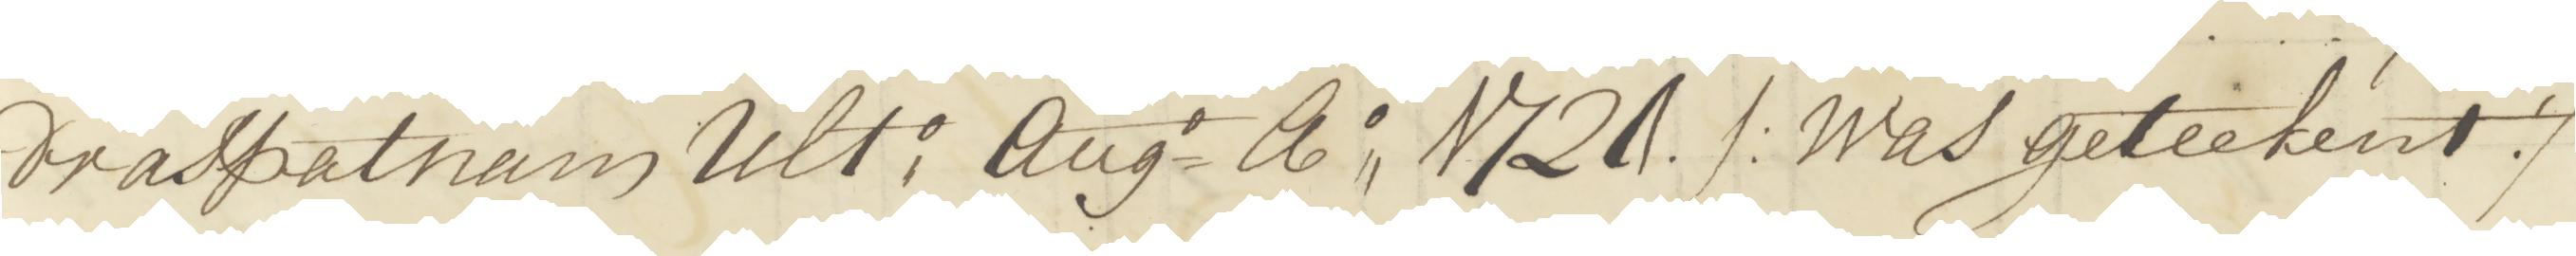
draspatnam ult„o Aug=o A„o 1724. /:was geteekent:/
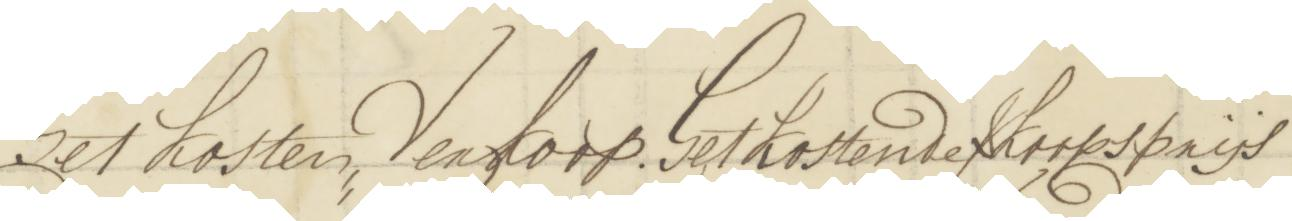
het kosten„ Verkoop. het kostende verkoopsprijs
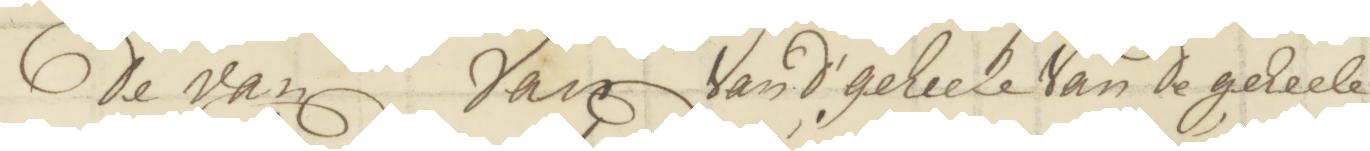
de van Van van d’ geheele van de geheele
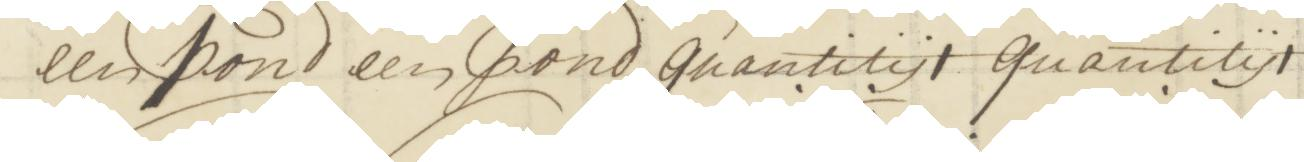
een pond een pond quantitijt quantitijt
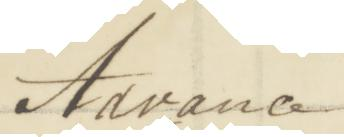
Advance
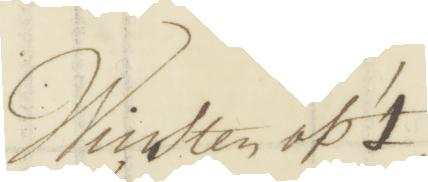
Winsten op ’t
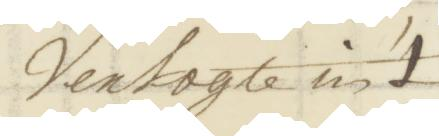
Verkogte in 't
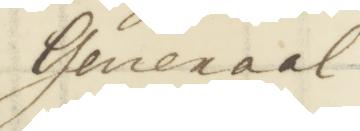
Generaal
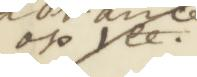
op 1 lb.
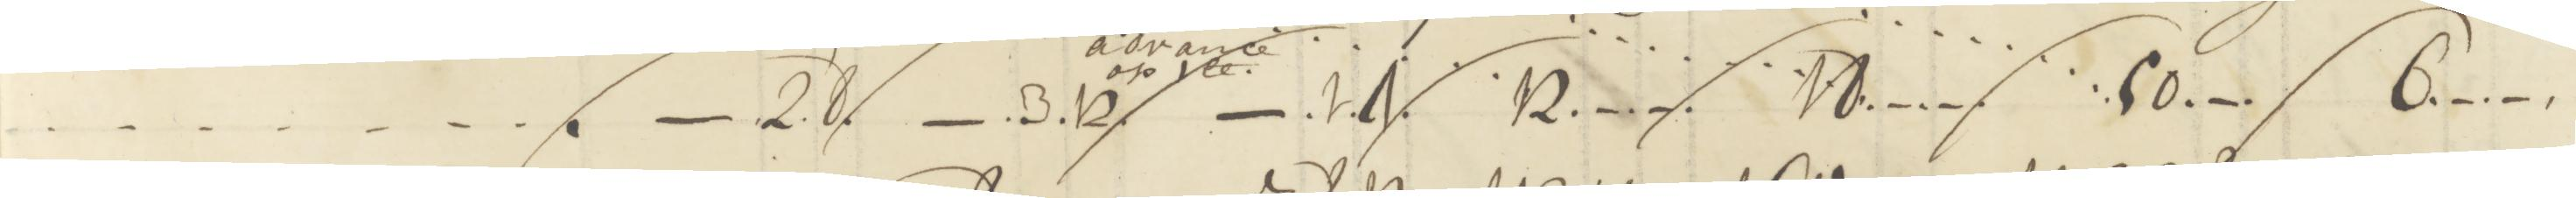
. - - - - - - ƒ —2.8 ƒ —.3.12 ƒ —.1.4 ƒ 12.-. ƒ 18.-.- ƒ 50.-. ƒ 6.-.-.
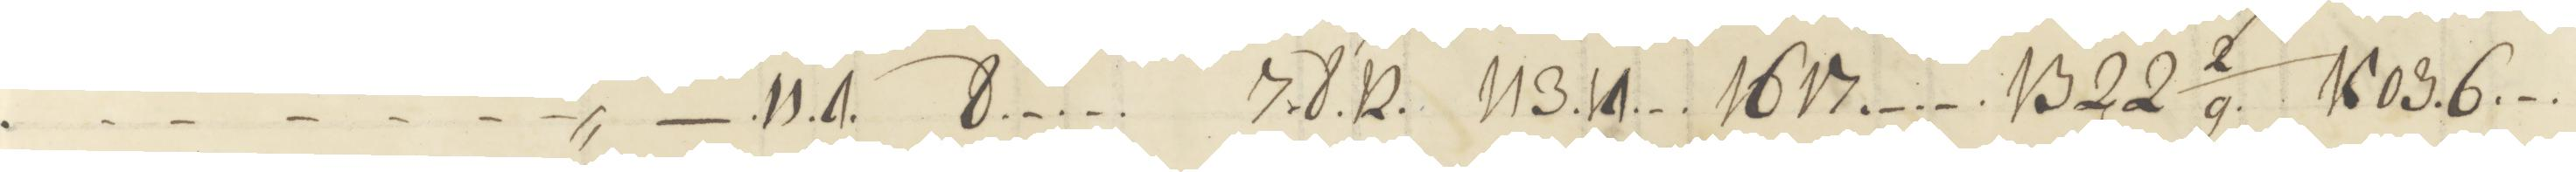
. - - - - - - - „ —.11.4. 8.-.-. 7.8.12. 113.14.-. 1617.-.-. 1322 2/9. 1503.6.-.
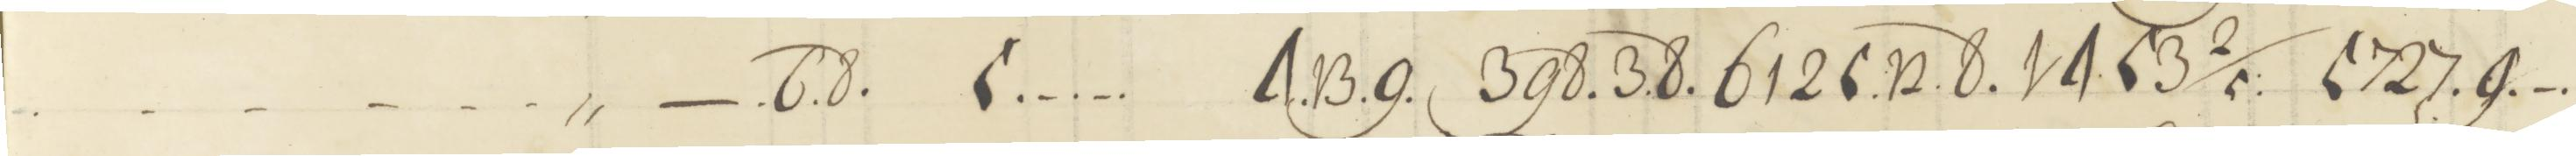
. - - - - - - „ —. 6.8. 5.-.-. 4.13.9. 398.3.8. 6125.12.8. 14.53 2/5. 5727.9.-
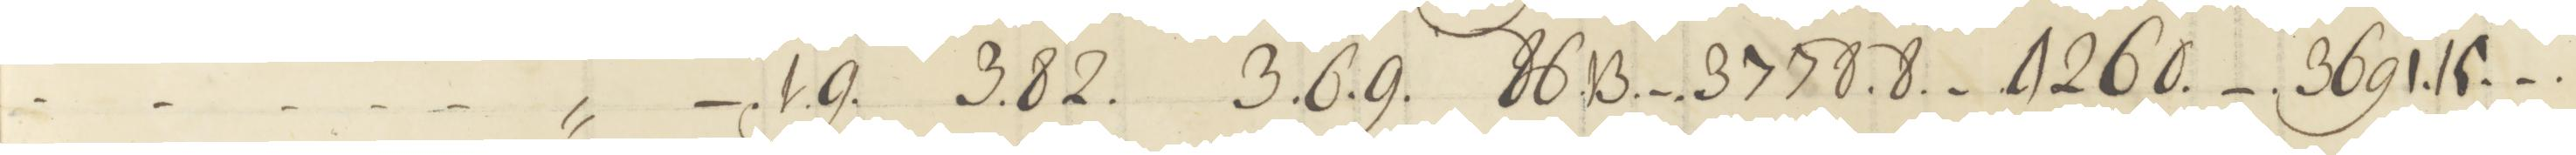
- - - - - „ —.19. 3.82. 3.6.9. 86.13.-. 3778.8.- 4260.-. 3691.15.-.
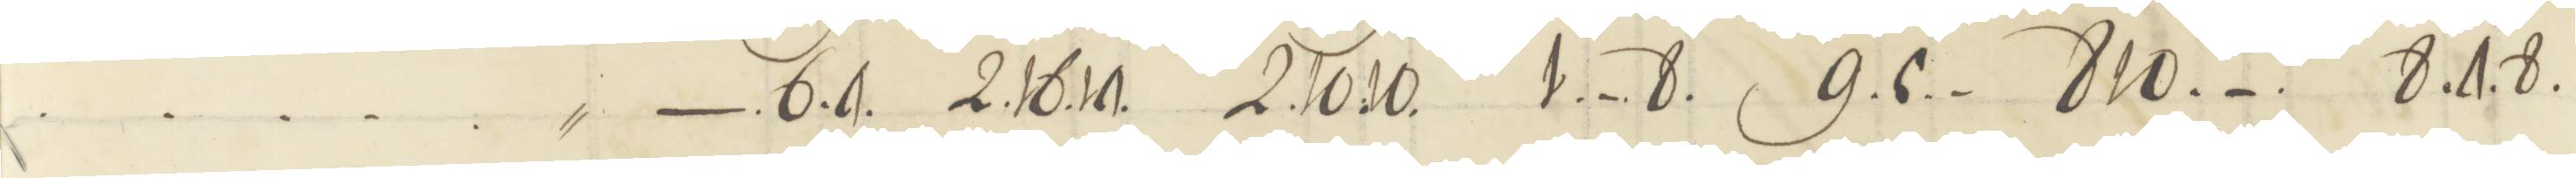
. - - - - . „ —.6.4. 2.16.14. 2.10.10. 1.-8. 9.5.- 810.-. 8.4.8.
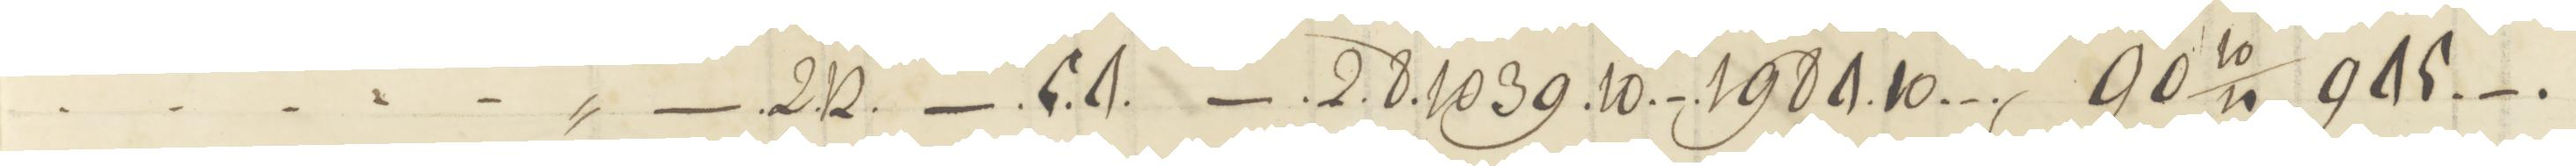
- - - - - „ —.2.12. —.5.4. —.2.8.1039.10.-.1984.10.-. 90 10/10 945.-.
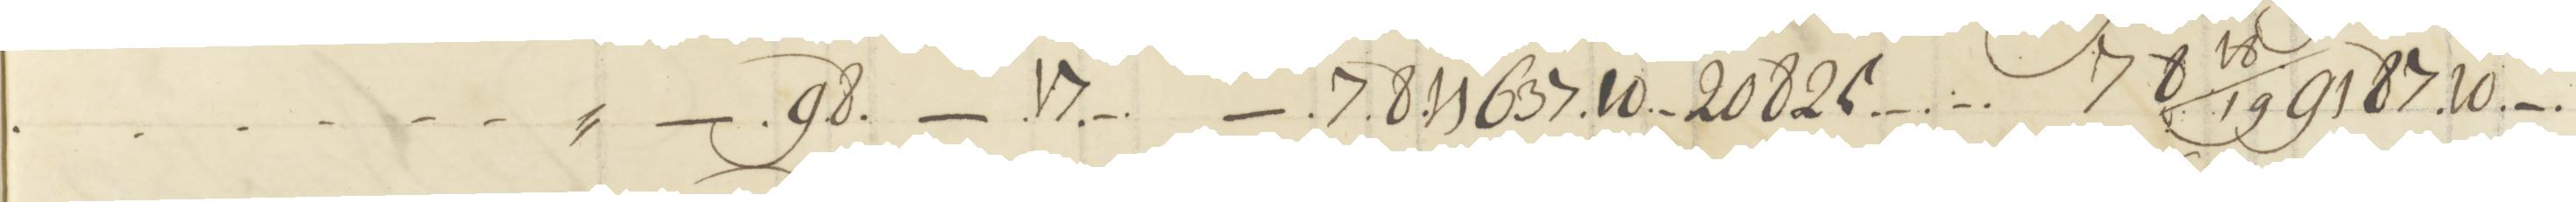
. . . - - - „ —. 98. — 17.-. —.7.8.11637.10.-20825.-.-. 78 18/19 9187.10.-.
